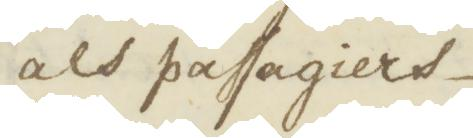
als passagiers —
